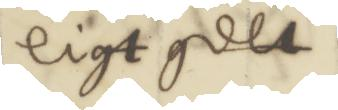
ligt gelt.
